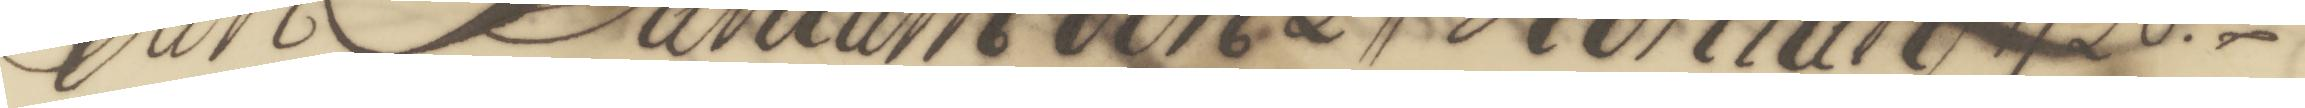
Van Bantam den 2„e Februarij 1720. —
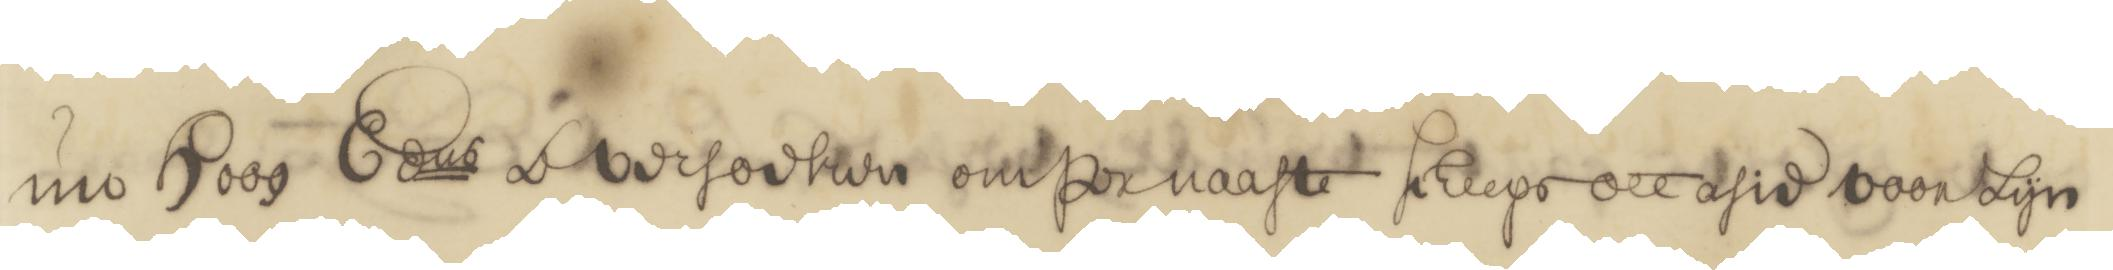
uw Hoog Ed=ns te versoeken om per naaste scheeps occasie voor zijn
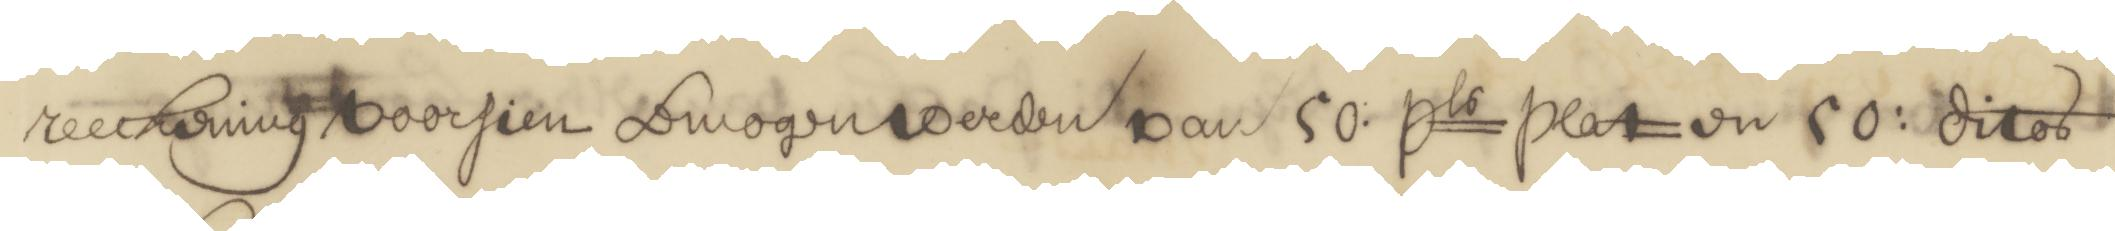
reeckening voorsien temogen werden van 50: p=ls plat en 50: ditos
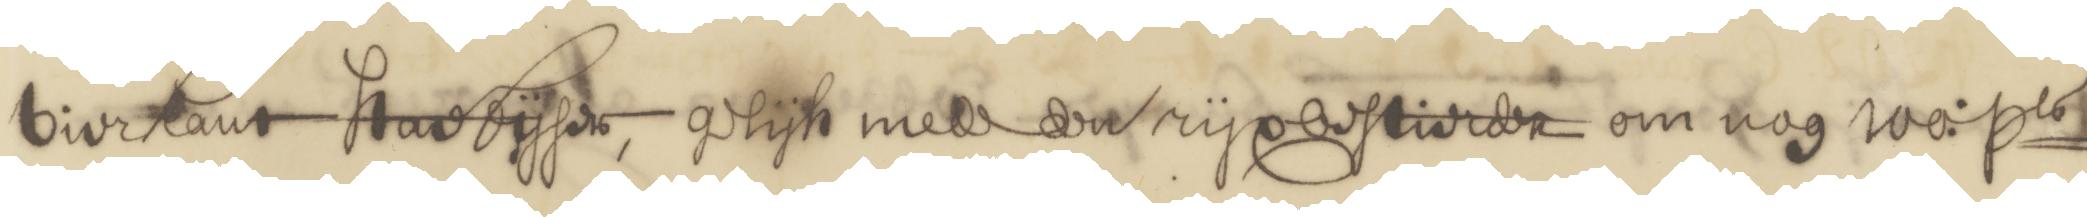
vierkant staefijser, gelijk mede den rijxbestierder om nog 100: p=ls
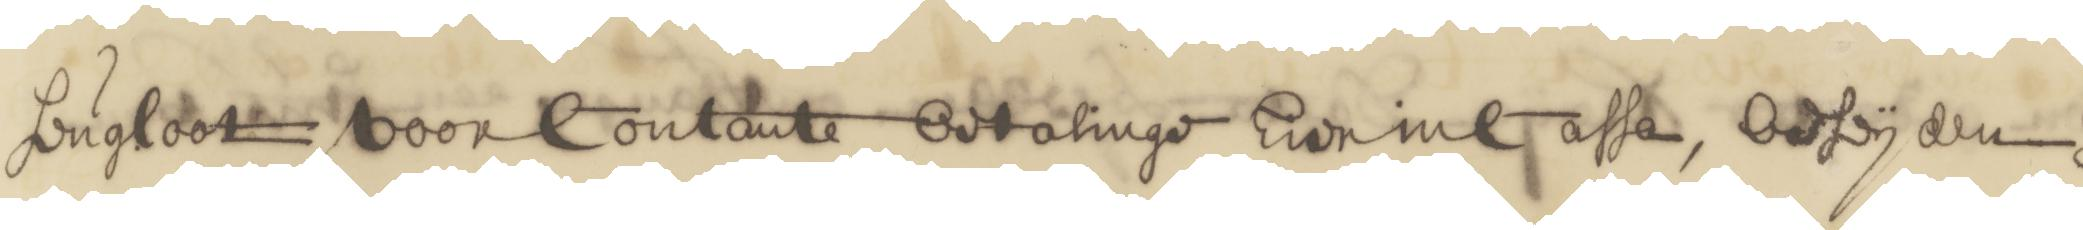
seugloot voor contante betalinge hier incassa, beseijden
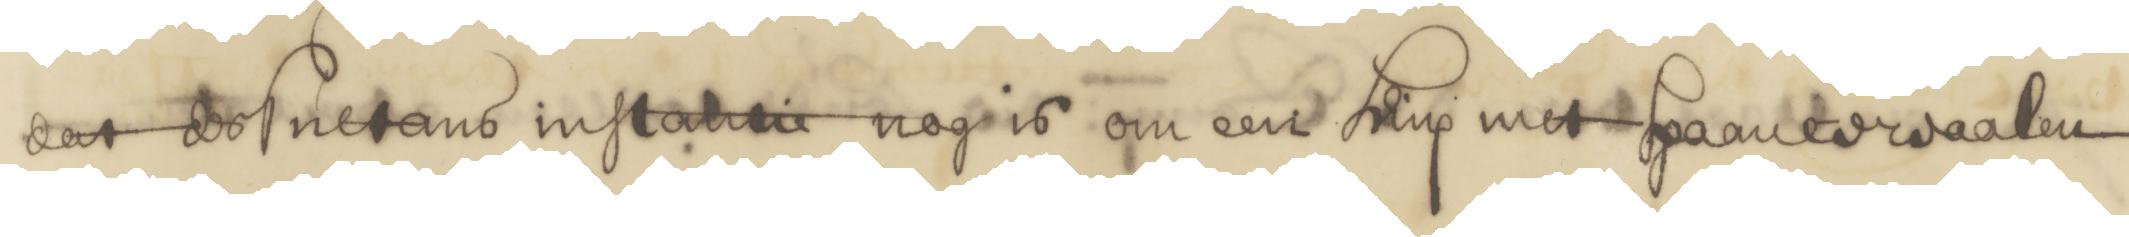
dat des sultans instantie nog is om een schip met spaancereaalen
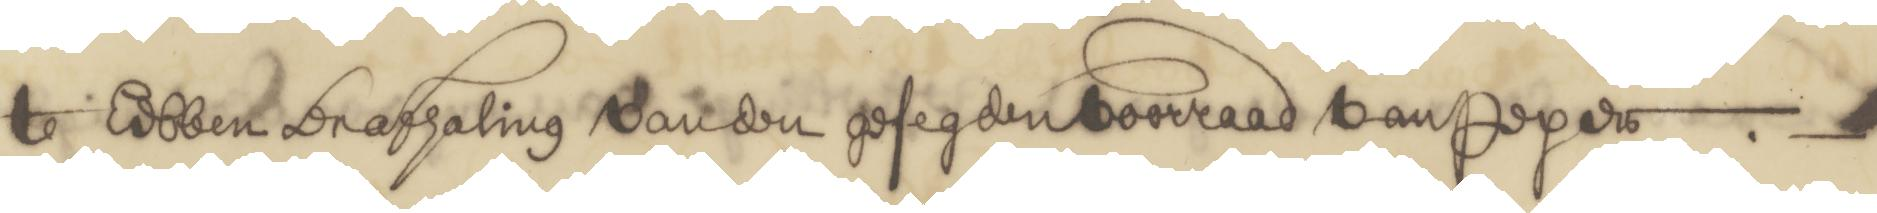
te hebben ter afhaling van den gesegden voorraad van Peper. —
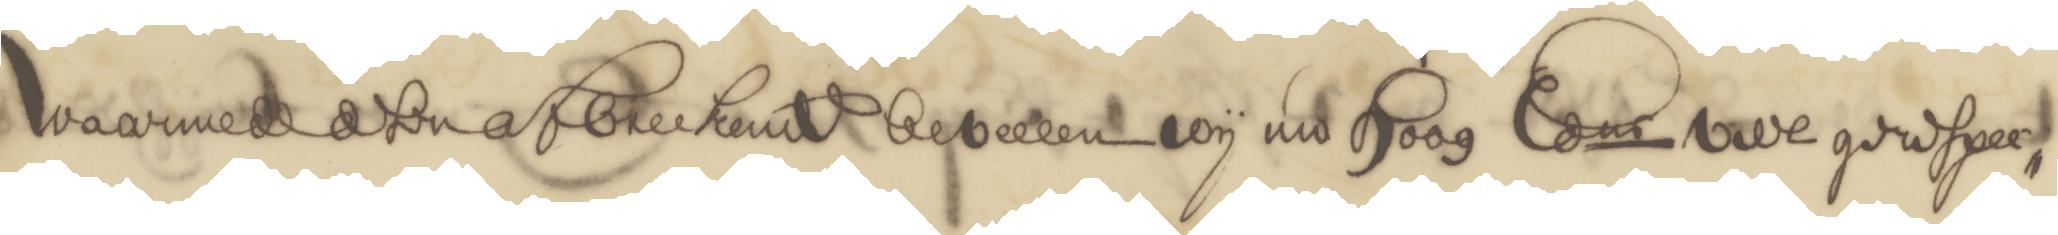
Waarmede desen afbreekende beveelen wij uw Hoog Ed_ns uwe gerespec„
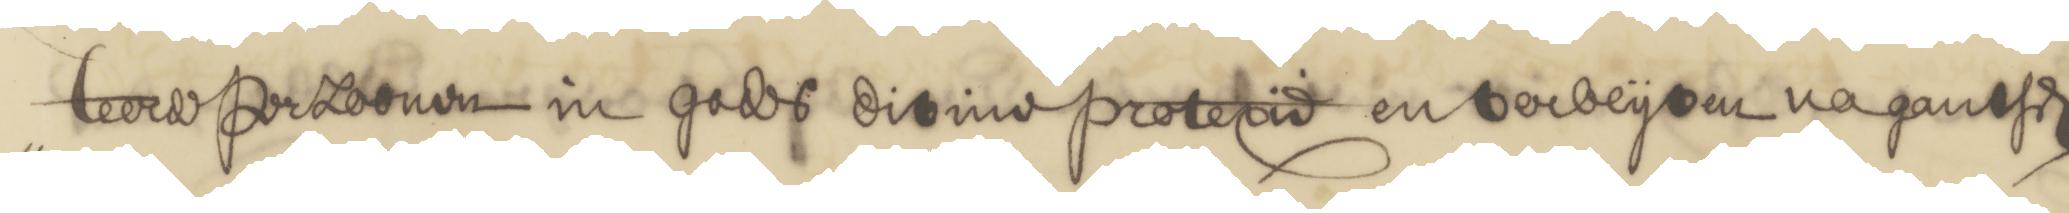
„teerde Perzoonen in godes divine protexie en verblijven na gantsch
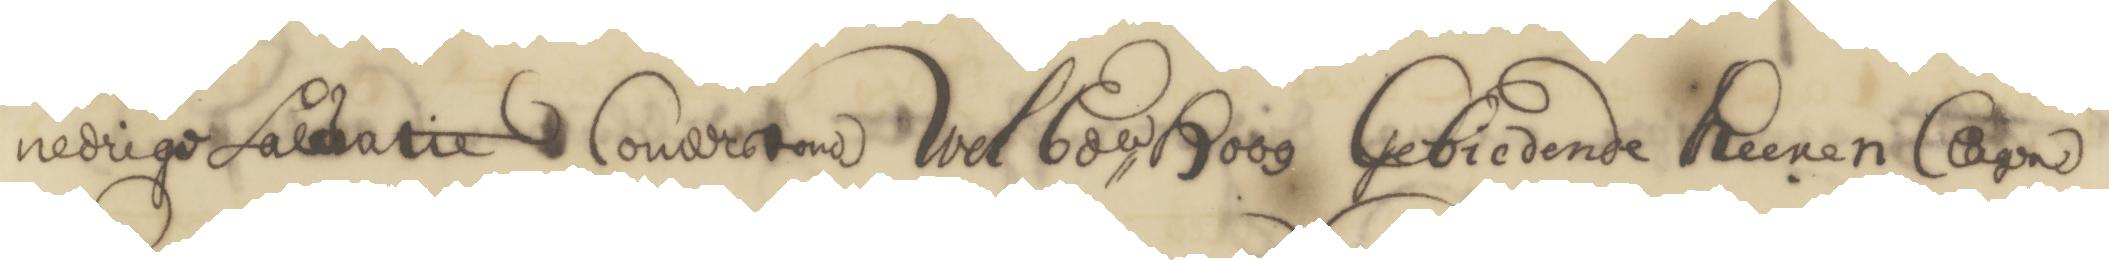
nedrige saluatie (onderstond) Wel Ed„en Hoog Gebiedende Heeren (lager)
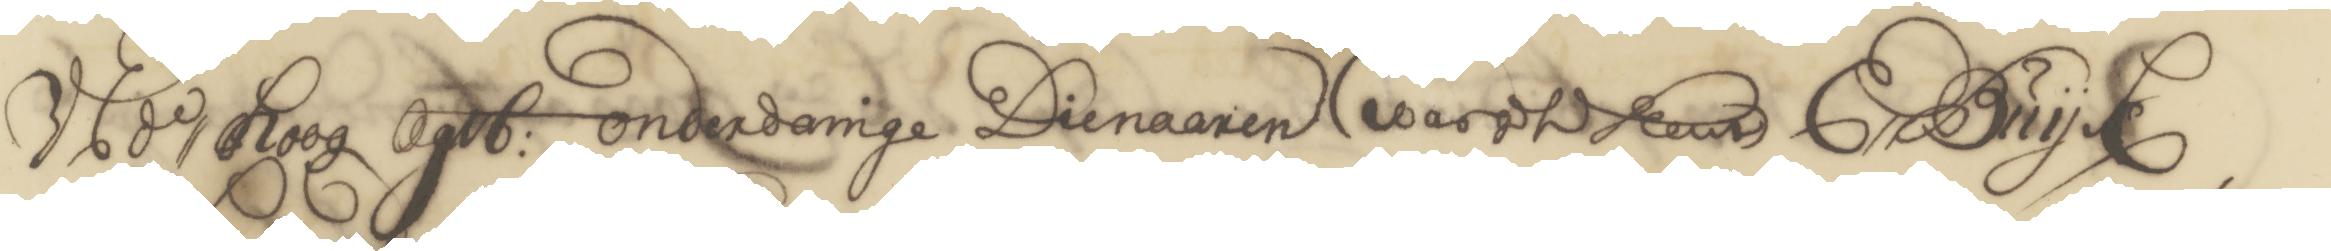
VEd„e Hoog Agtb: onderdanige Dienaaren (was getekent) E„ Buijk,
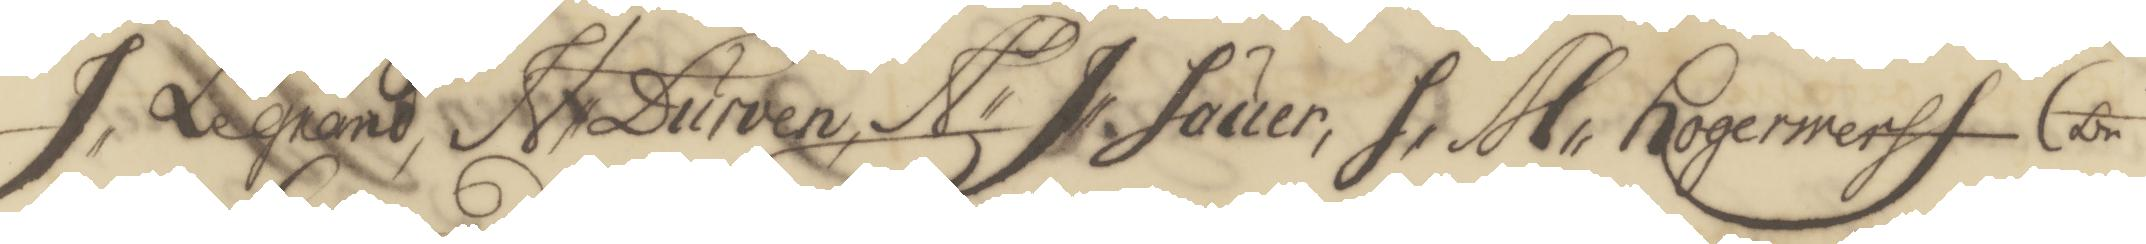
J„ Legrand, H„ Durven, A„ J„ Sauer, S„H„ Hogerwerff (ter
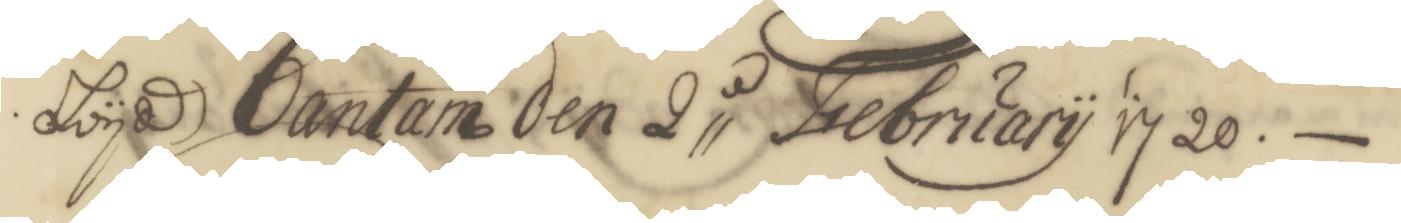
zeijde) Bantam den 2„e Februarij 1720. —
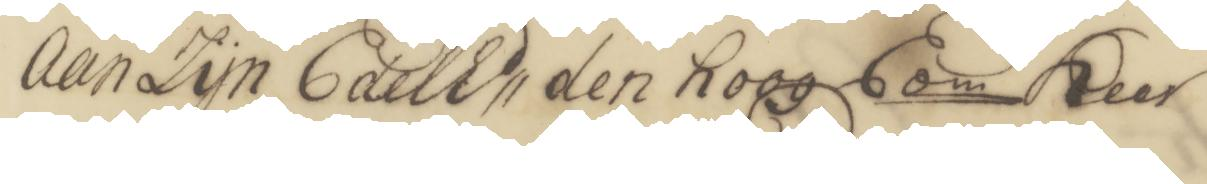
aan zijn Edelh„d den hoog Ed=m Heer
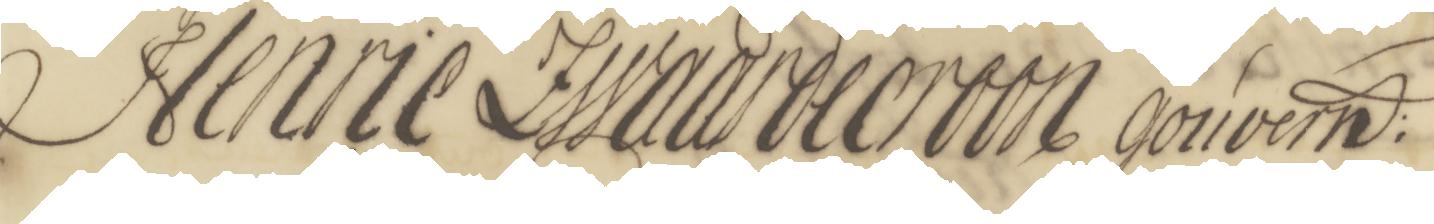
Henrie Zwaardecroon Gouvern:
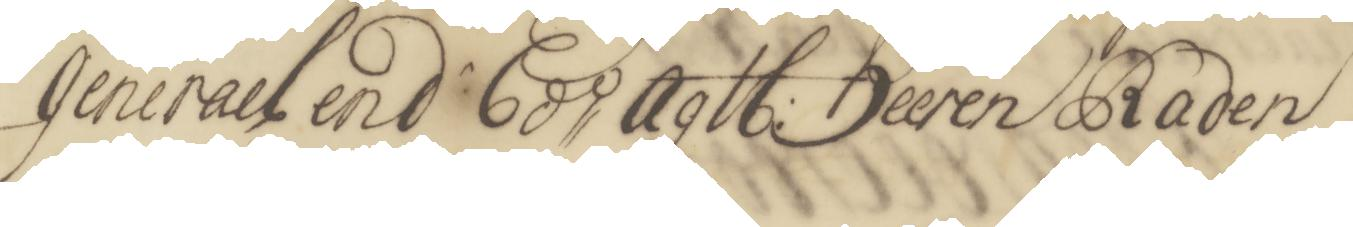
Generael end: Ed„e Agtb: Heeren Raden
